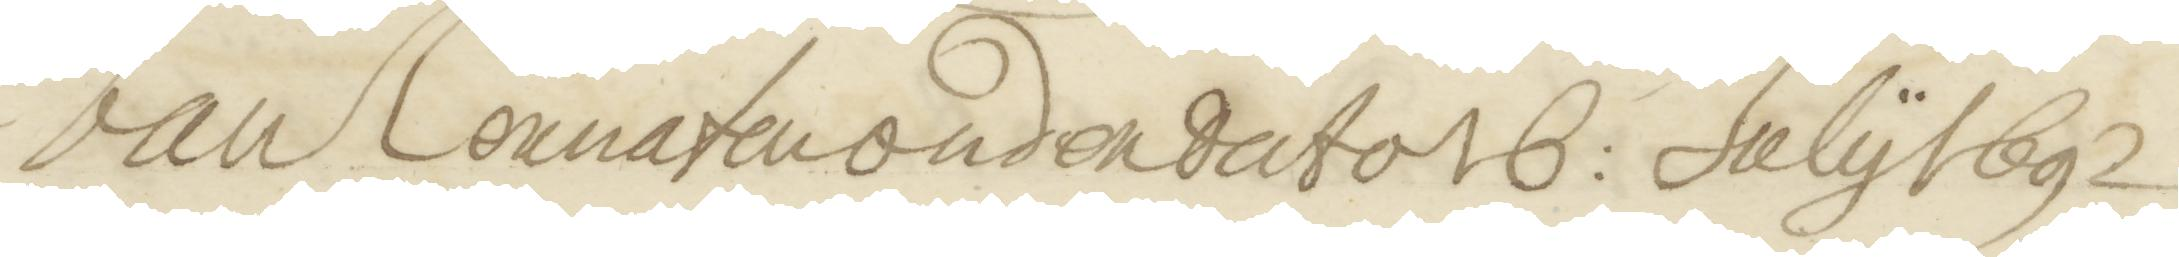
Van Ternaten onder dato 16:' Iulij 1692
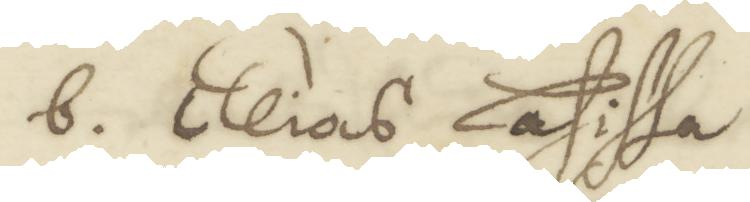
b. Ellias Lasissa
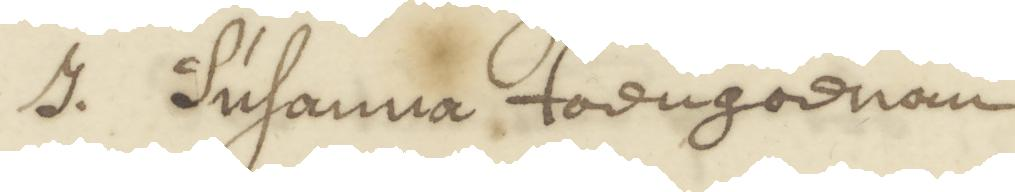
I. Susanna toengoenan
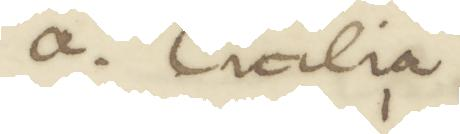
a. Cicilia
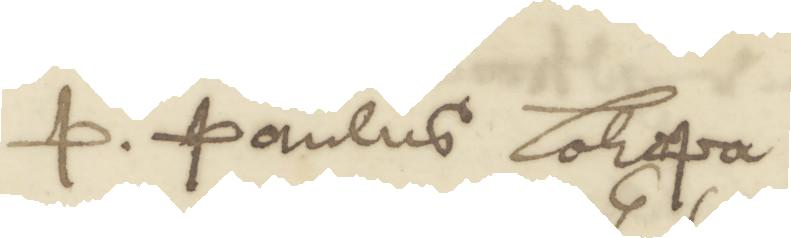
p. paulus Lohopa
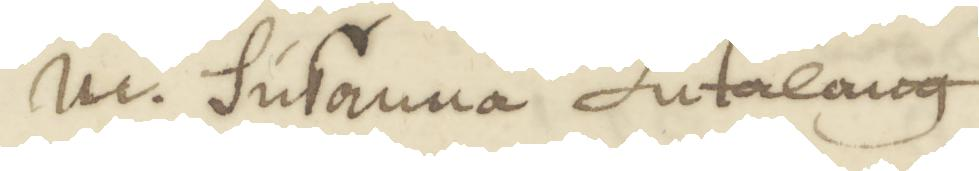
m. Susanna Intalang
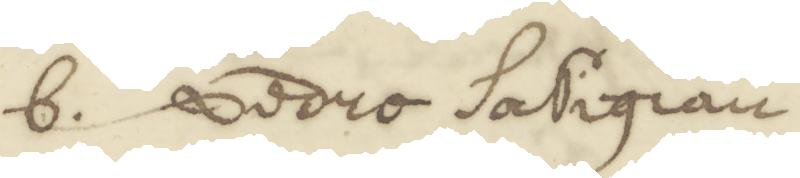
b. pedro sasigiau
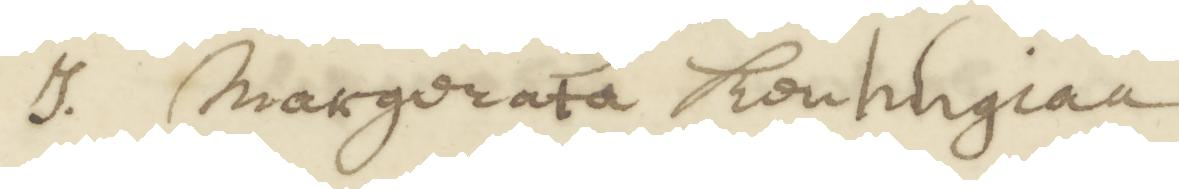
I. margerata kentergiar
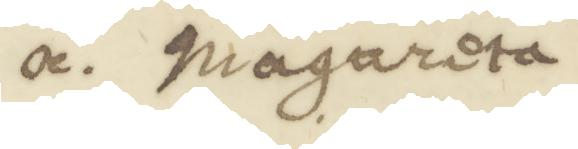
a. magareta
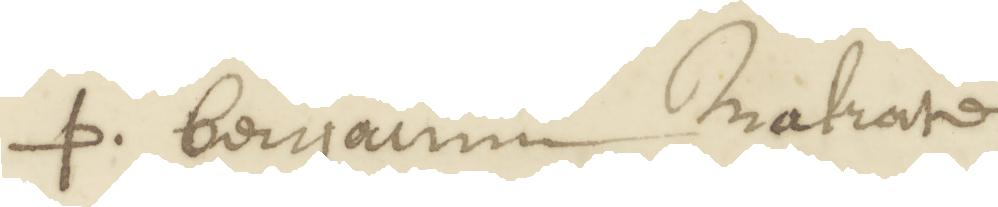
p. benjamin makate
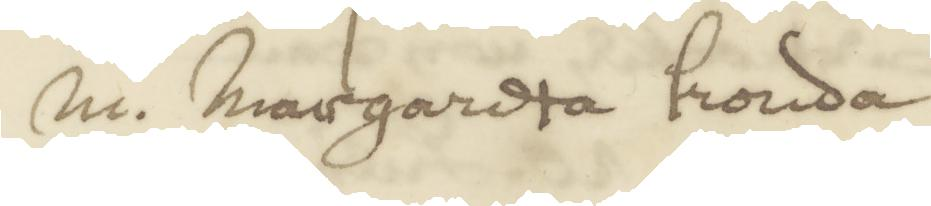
m. margareta konda
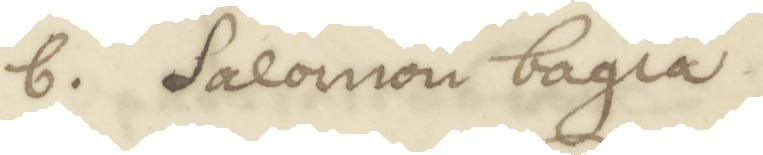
b. salomon bagia
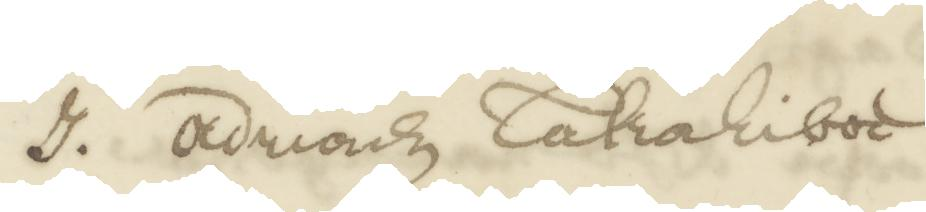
I. adriaen Takahiboe
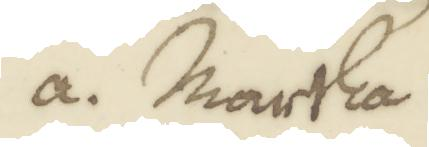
a. Martha
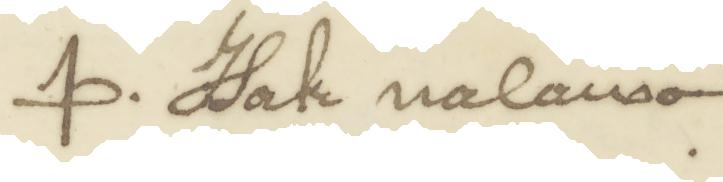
p. Isak nalawo
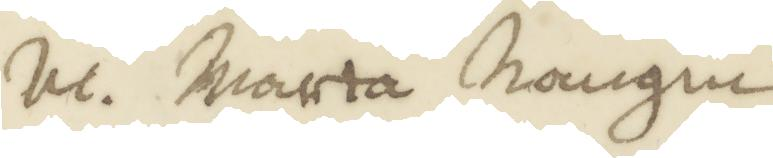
m. marta Nangin
